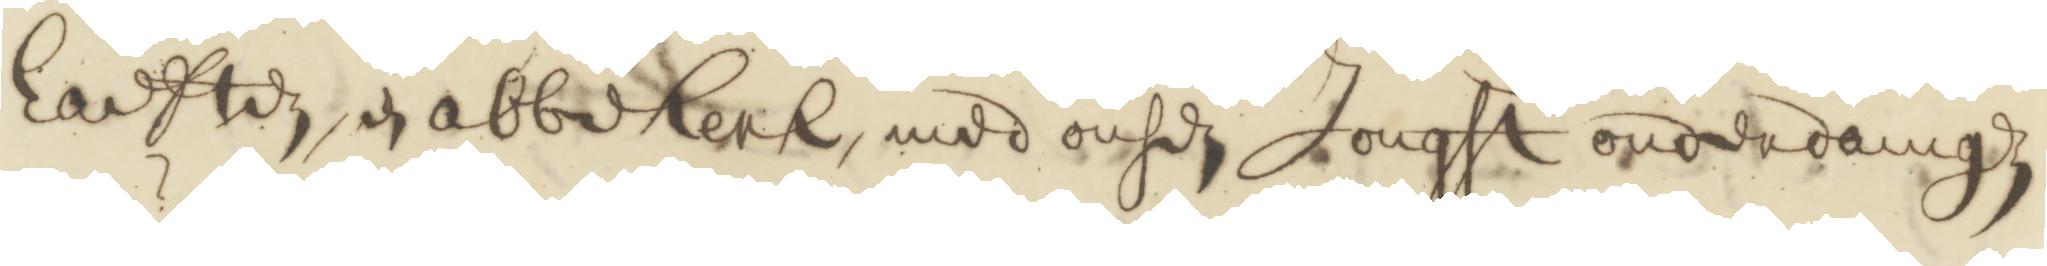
haeften, en abbekerk, med onsen Jongst onderdanigen
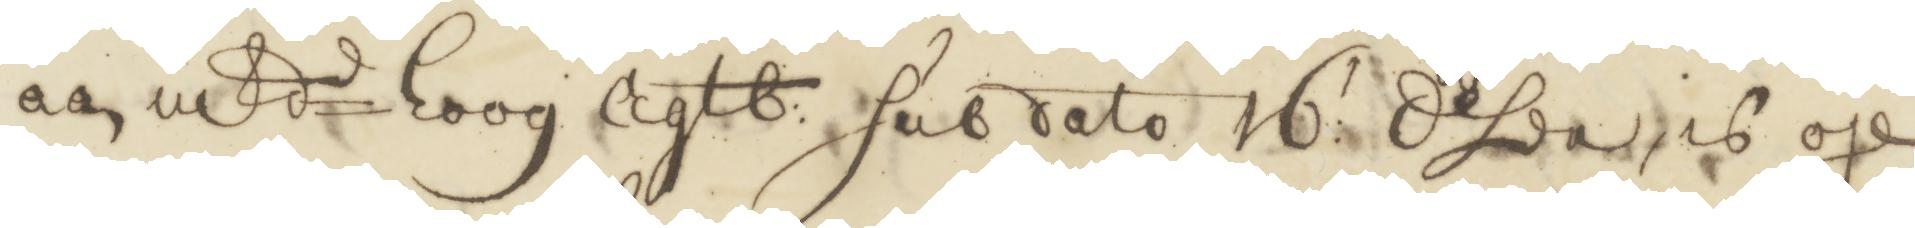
aan uEd=e hoog agtb: sub dato 16:' deser, is op
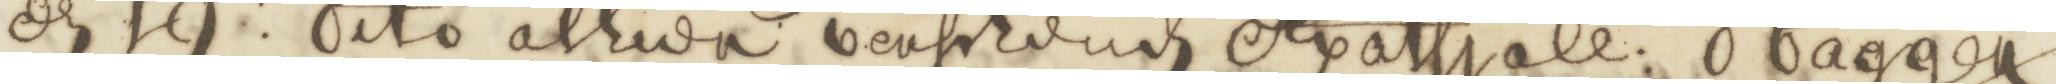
den 19:' dito alhier verschenen de patsjall: d’ bagger
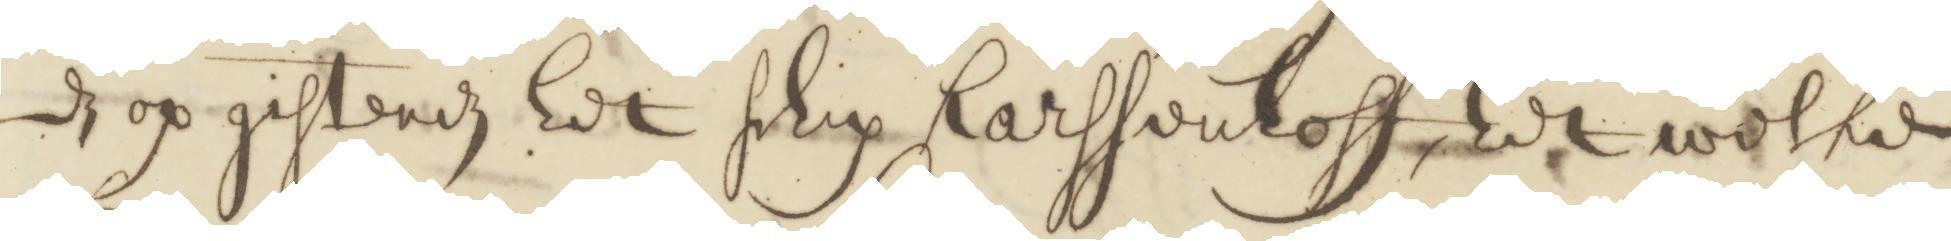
en op gisteren het schip karssenhoff, het welke
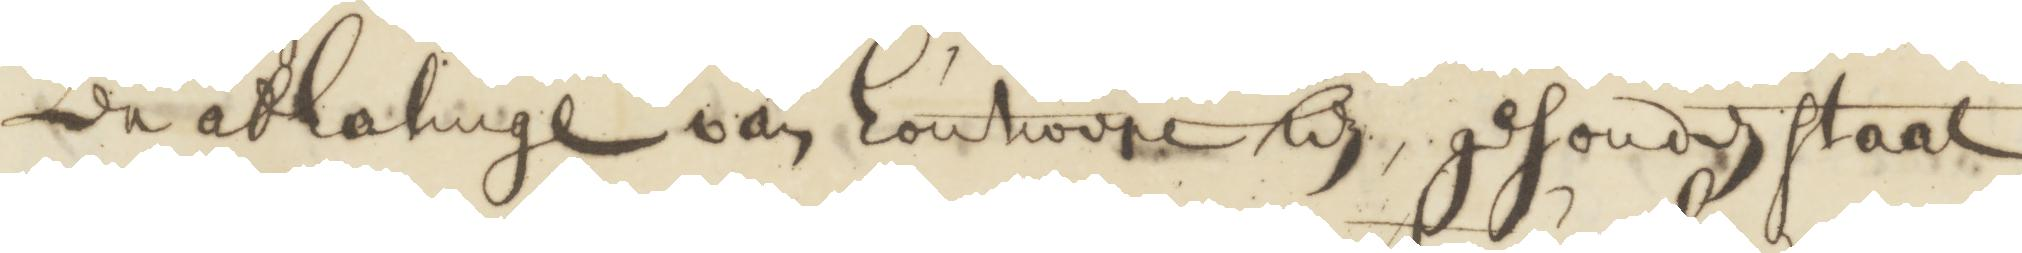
ter afhalinge van houtwercken, gesonden staat
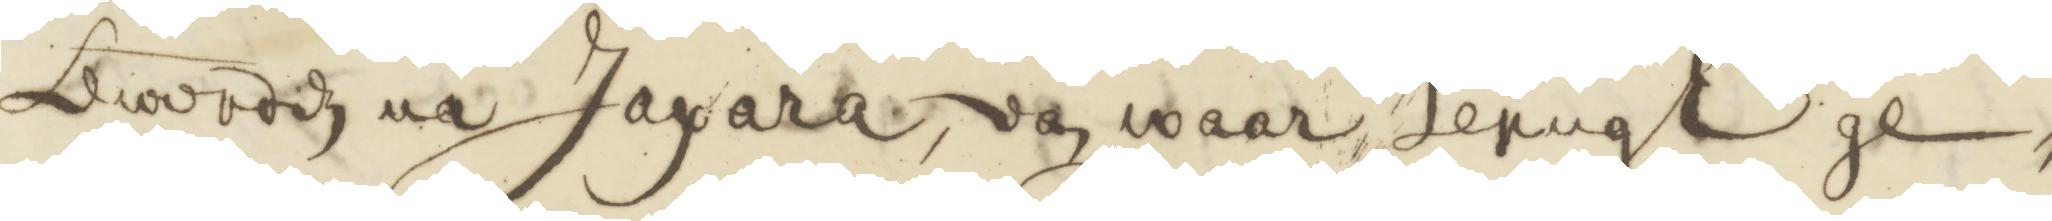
te werden na Japara, van waar, terugh ge
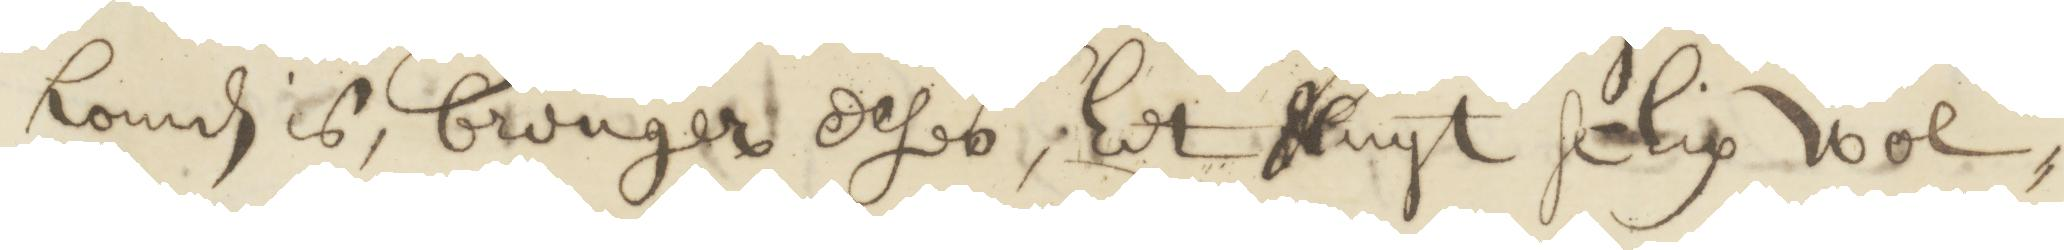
komen is, brenger deses, het fluijt schip wol„
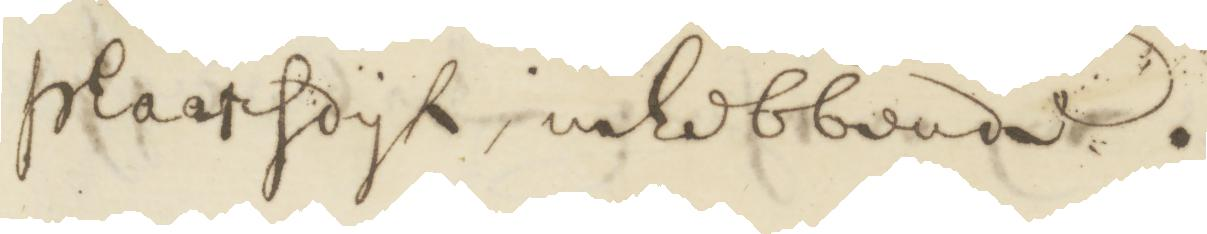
phaarsdijk, inhebbende.
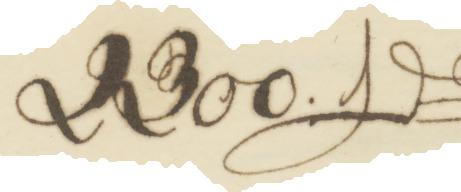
2300: P=s
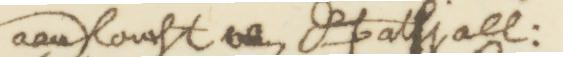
aankomst van de patsjall:
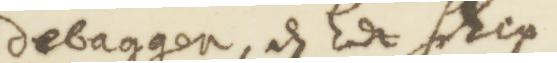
de bagger, en het schip
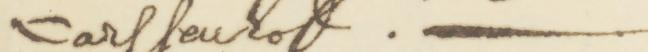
Carssenhof. —
